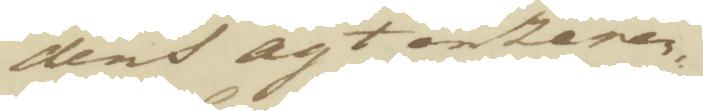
dens agt en Zeven„
